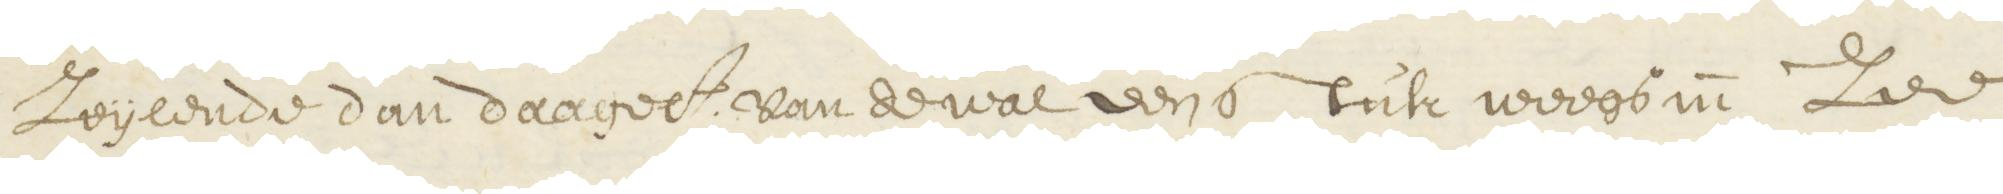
Zeijlende dan daagelijks van de wal een stuk weegs in Zee
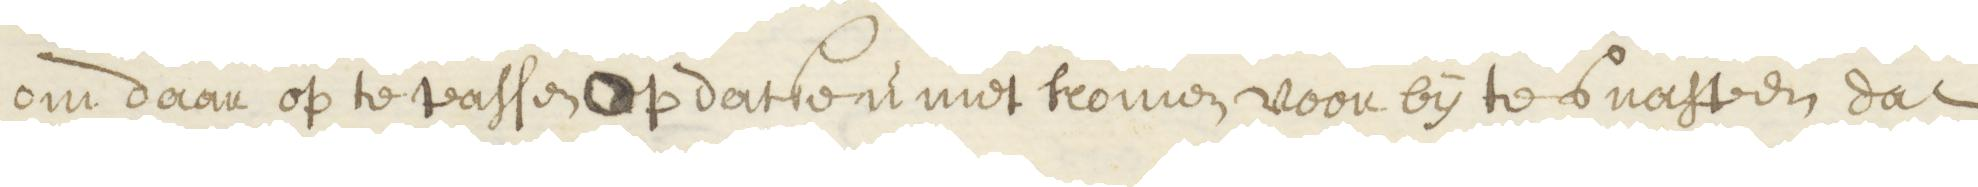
om daar op te passen op dat se u niet komen voorbij te snappen dat
